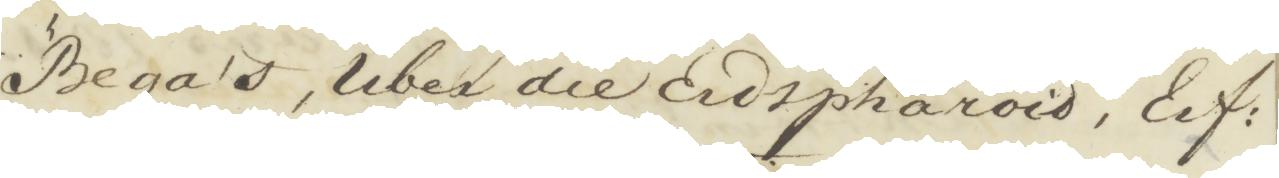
Bega's, uber die Erdspharoid, Erf:
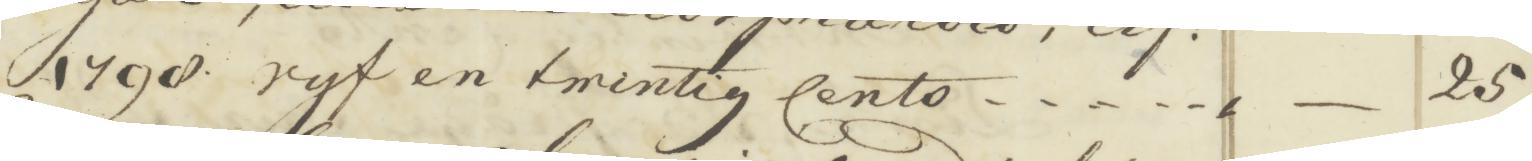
1798. vyf en twintig cents - - - - - „ — 25
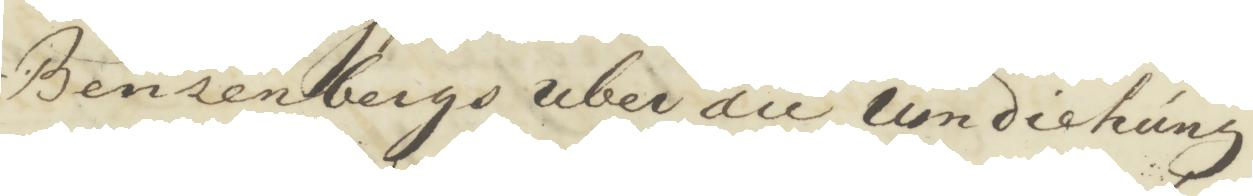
Benzenbergs uber die umdrehung
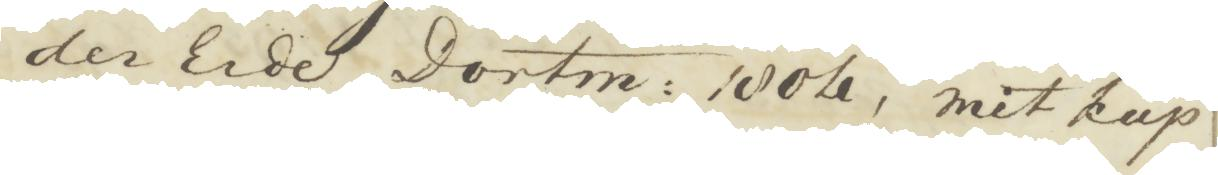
der Erde, Dortm: 1804, mit kup
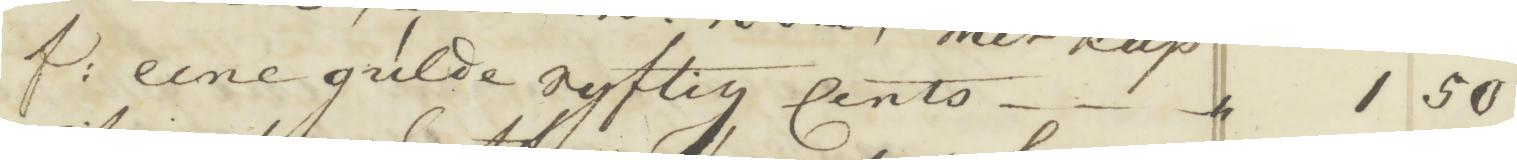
f: eene gulde vyftig cents - - „ 1 50
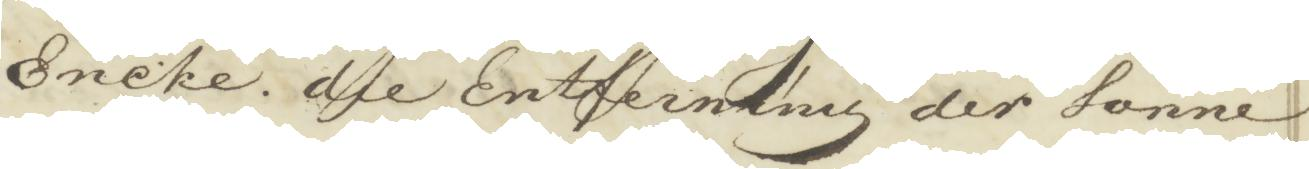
Encke. die Entfernung der Sonne
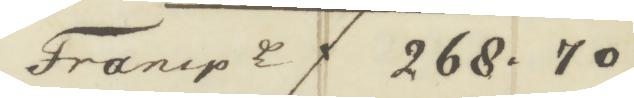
Transp=e ƒ 268. 70
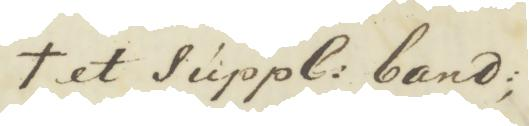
et suppl: band:,
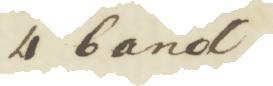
4 band.
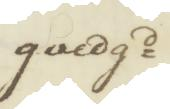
goedg=d
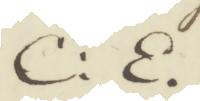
C: E.
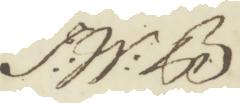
I: W: B
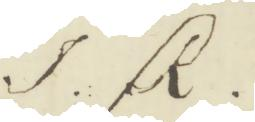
I: R.
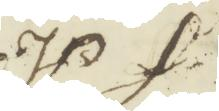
H S
